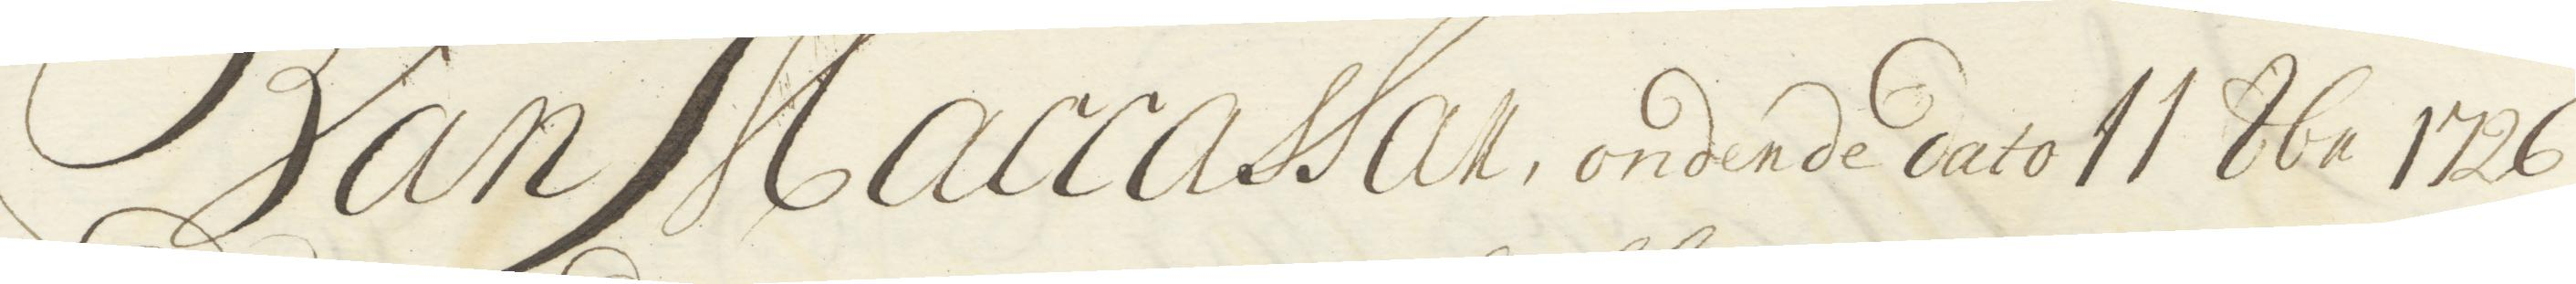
Van Maccassar, onder de dato 11 8br 1726
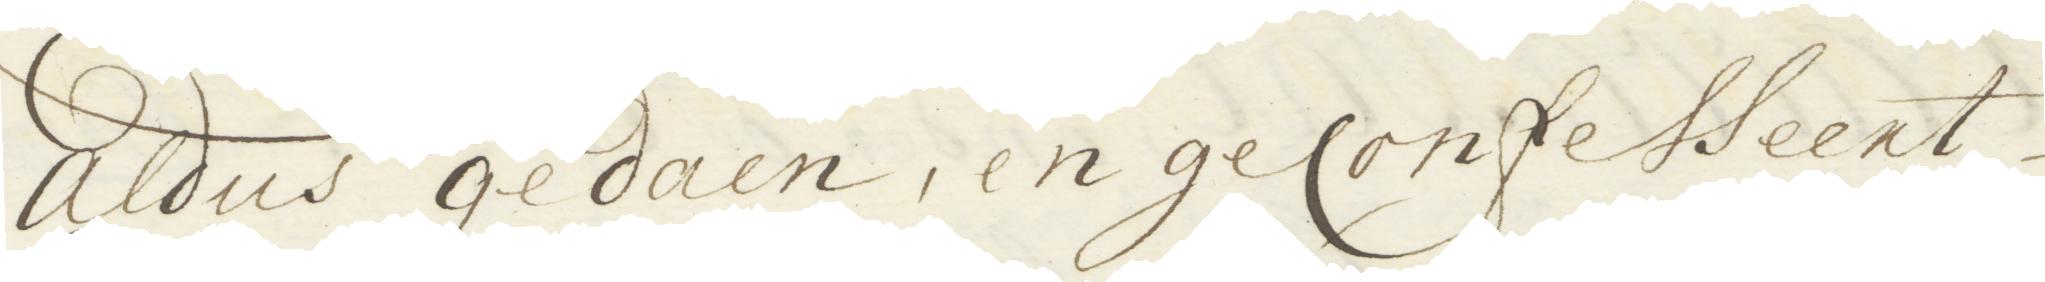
aldus gedaen, en geconfesseert
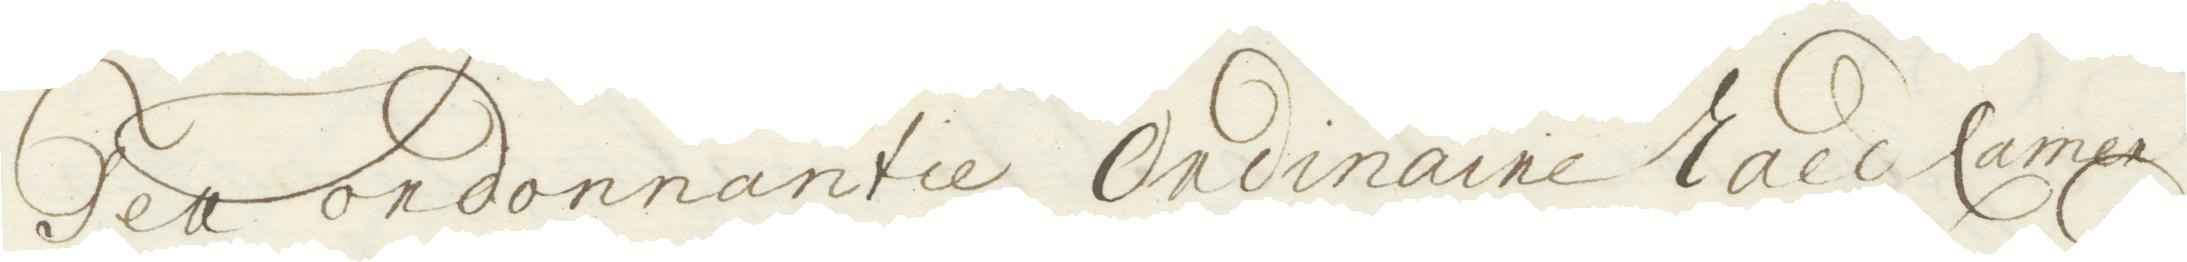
Ter ordonnantie Ordinaire Raed Camer
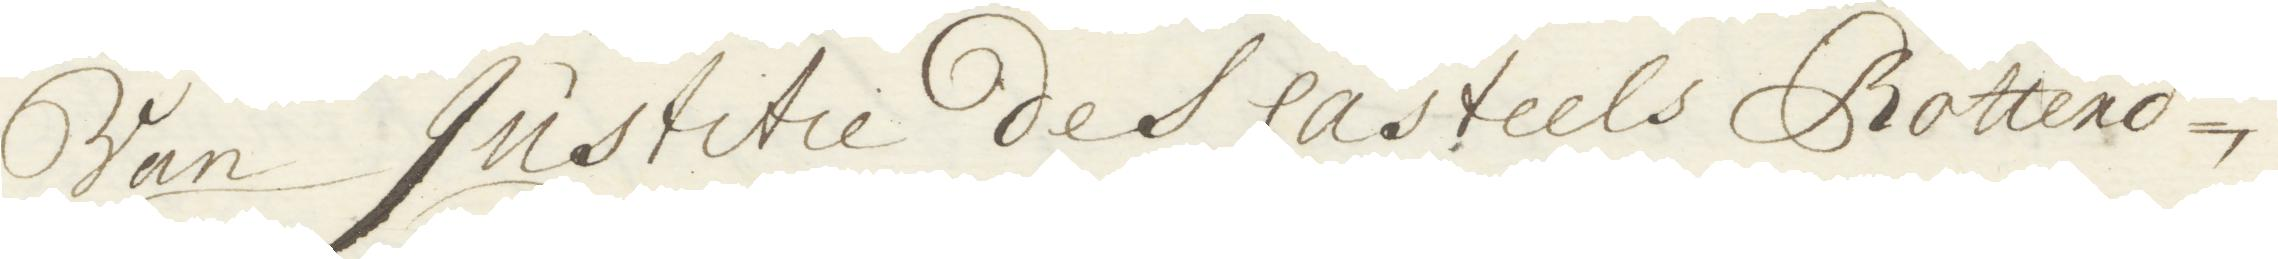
Van Justitie des Casteels Rotterd=m,
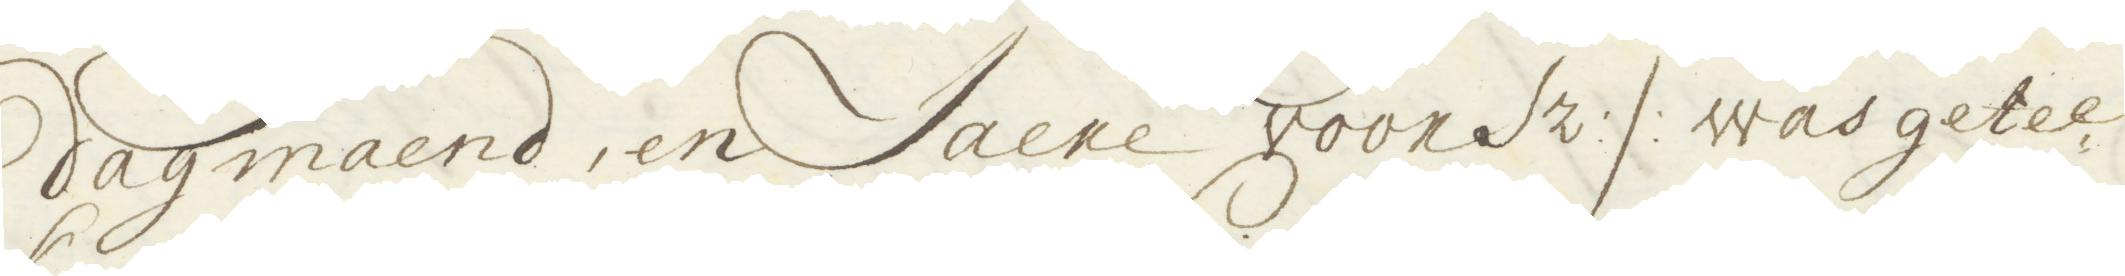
dag maend, en Iaere voorsz: /: was getee=
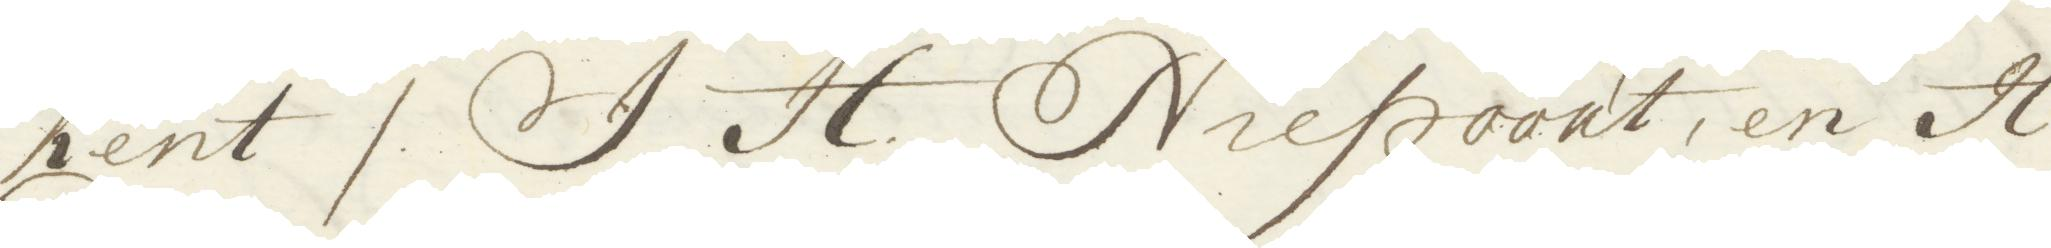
kent /. I H. Niepoort, en H
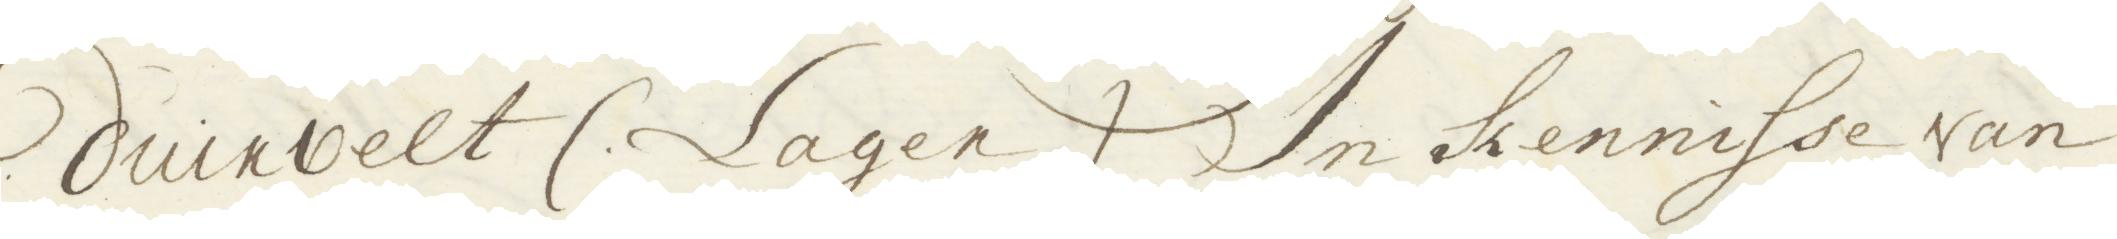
duirvelt (:Lager) In kennisse van
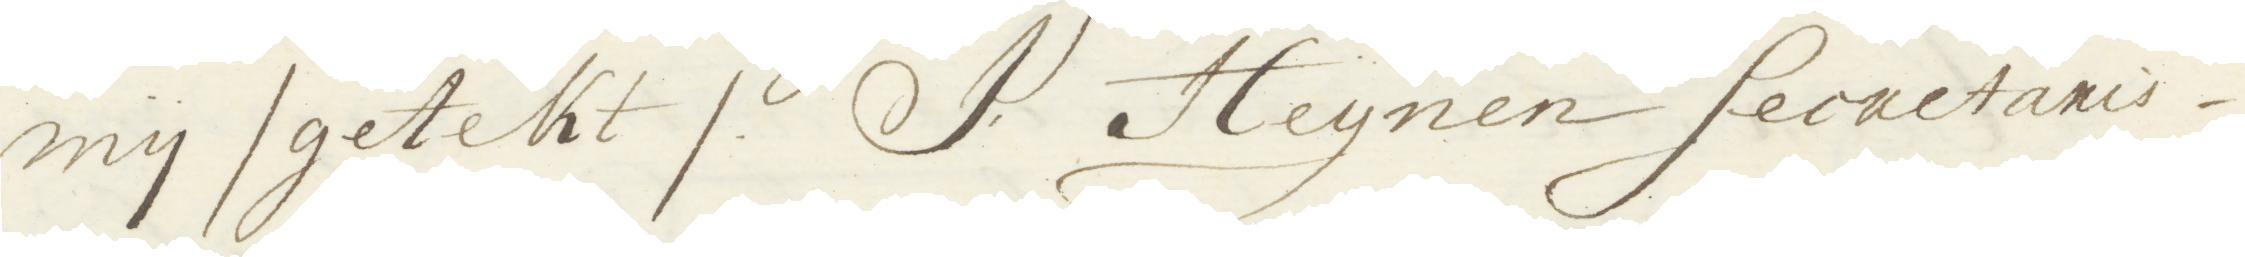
mij /getekt /. I. Heijnen Secretaris –
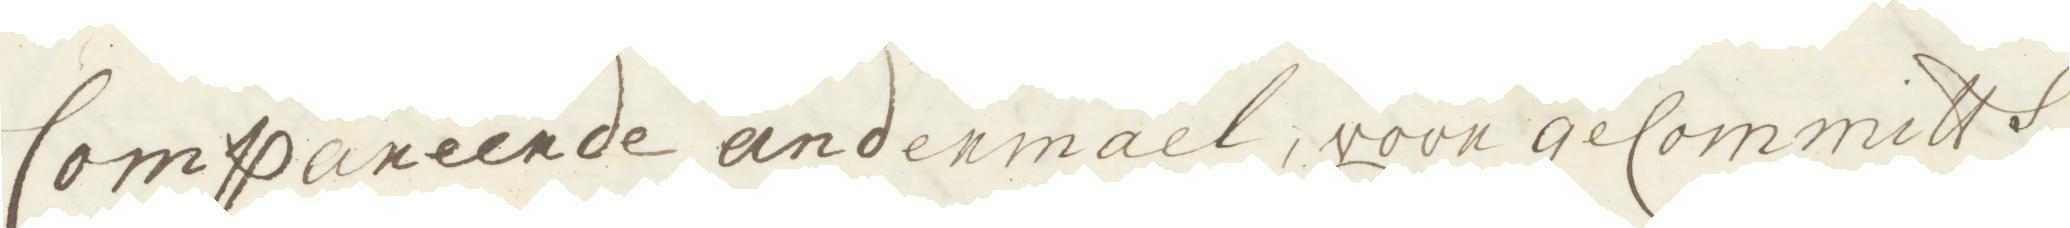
Compareerde andermael, voor gecommitt:s
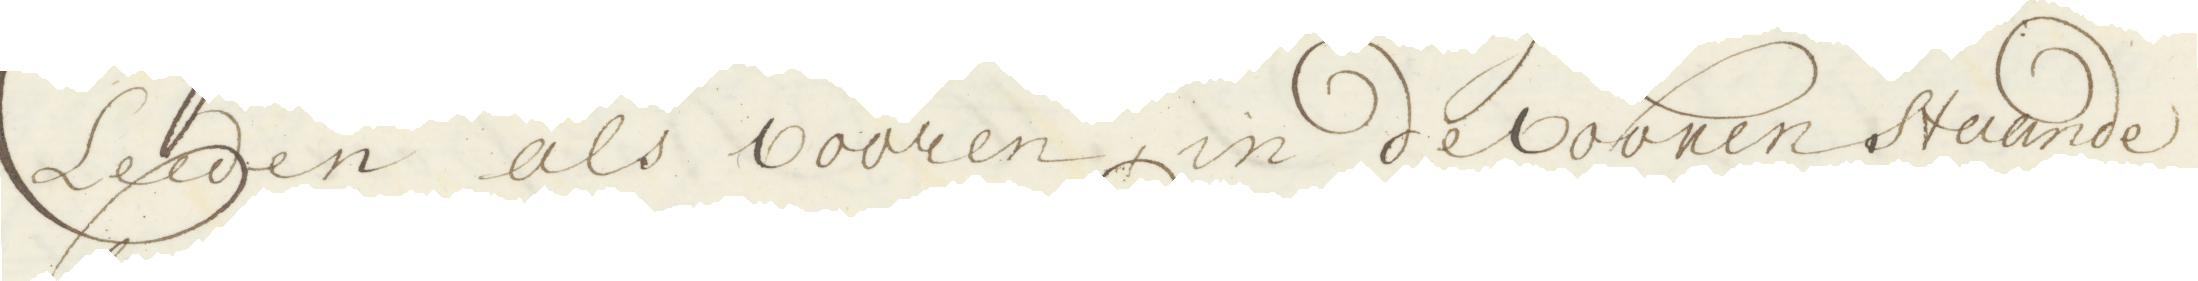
Leeden als vooren, in de vooren staande
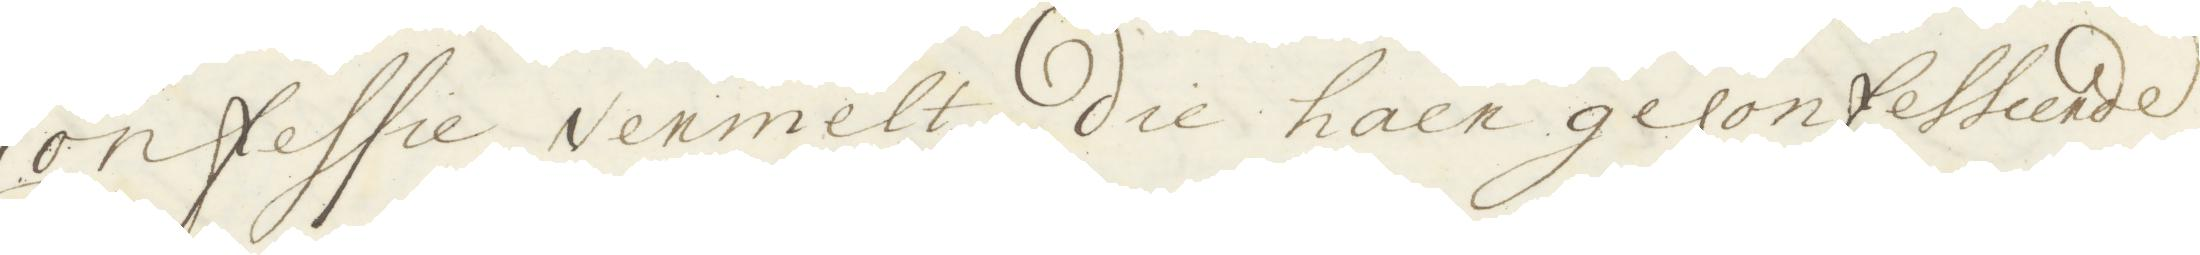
Confessie vermelt, die haer geconfesseerde
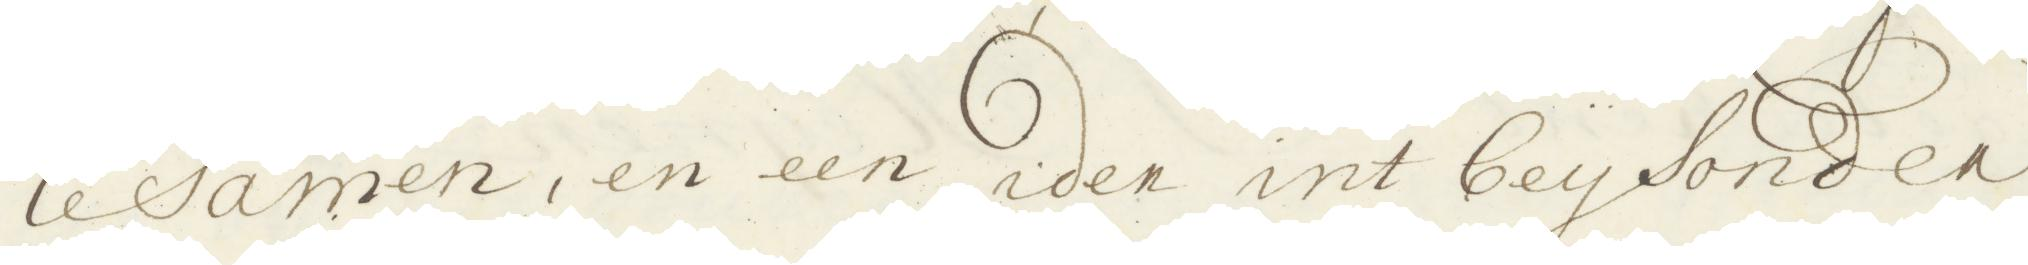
tesamen, en een ider int beijsonder
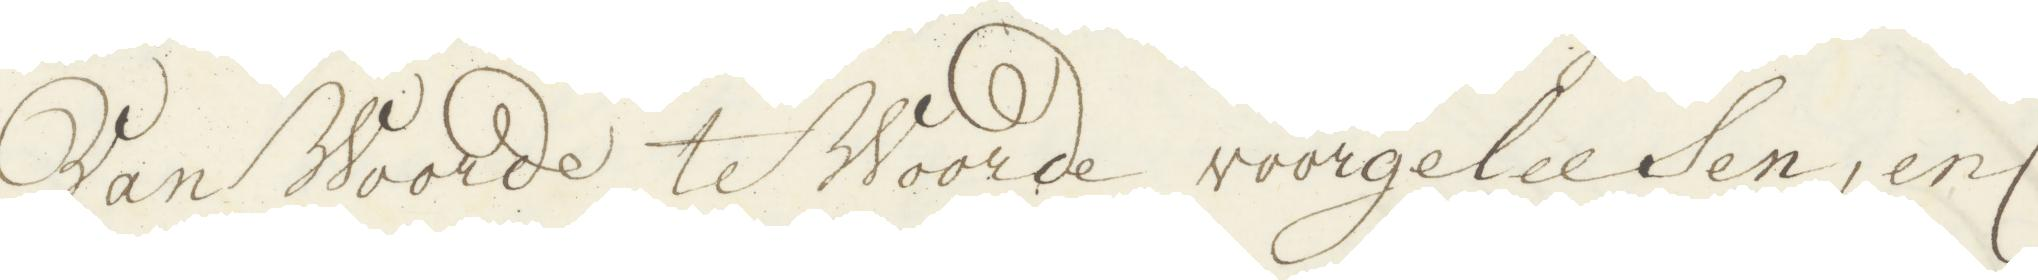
Van Woorde te Woorde voorgeleesen, en
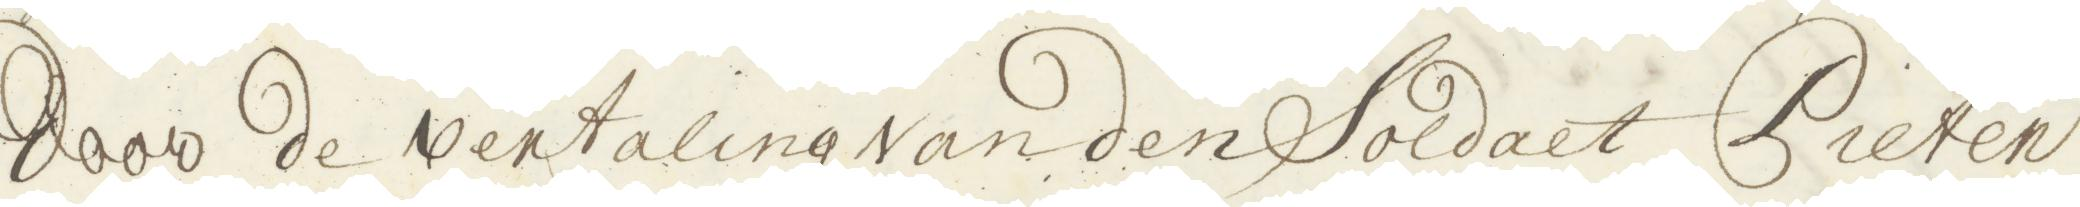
door de vertaling van den soldaet Pieter
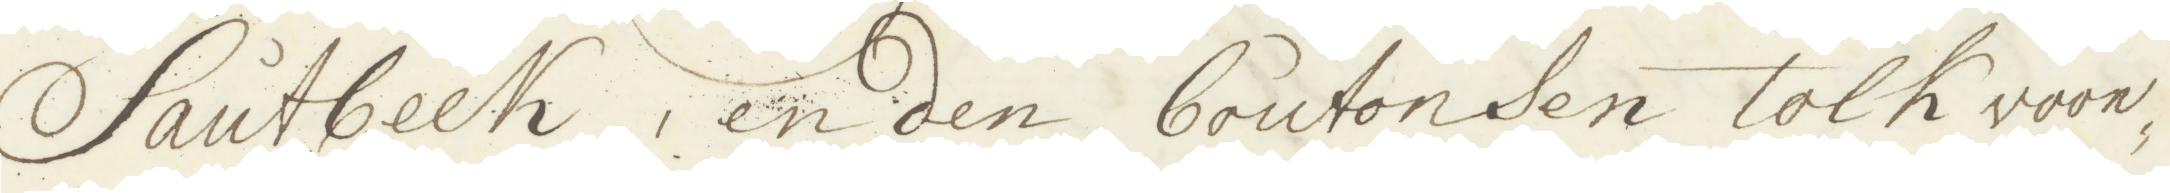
Sautbeek, en den boutonsen tolk voor„
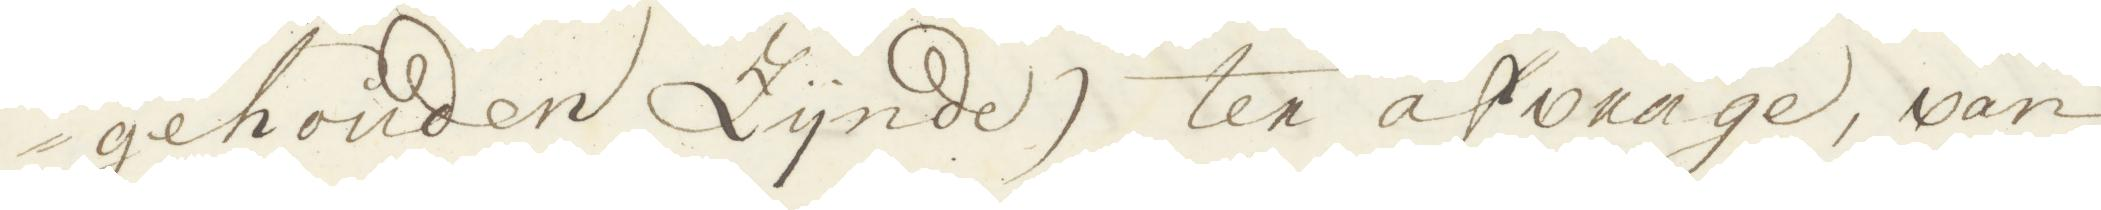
=gehouden zijnde) ter afvrage, van
